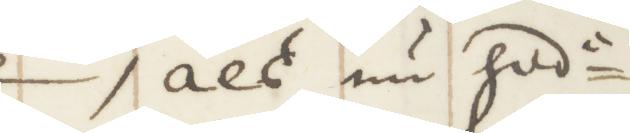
, als nu ged=e
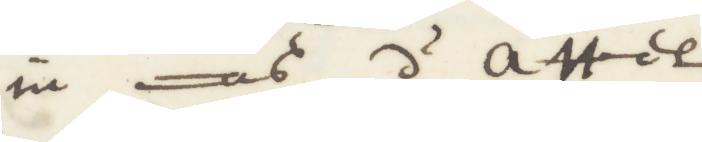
in cas d’ appel
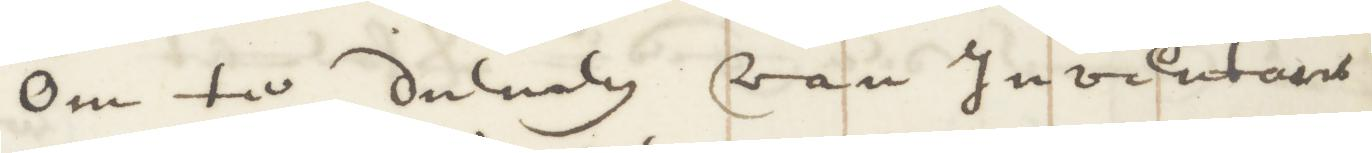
om te dienen van Jnventars
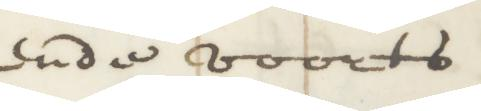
ende voorts
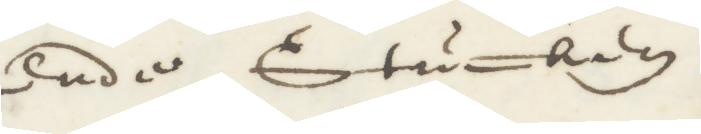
ende Stucken
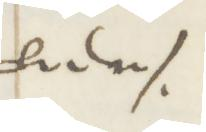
ken/.
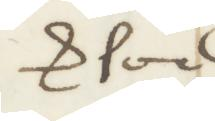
versoe
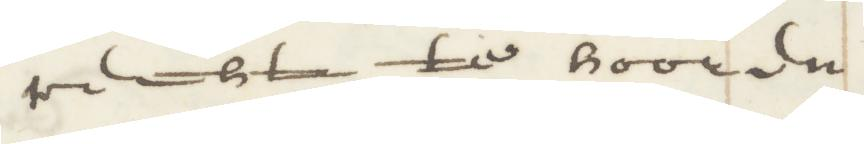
recht te hooren
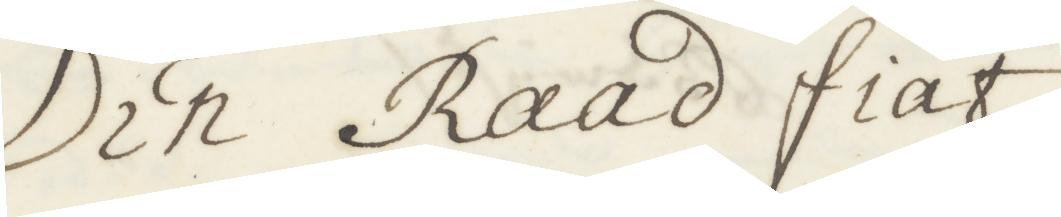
Den Raad fiat.
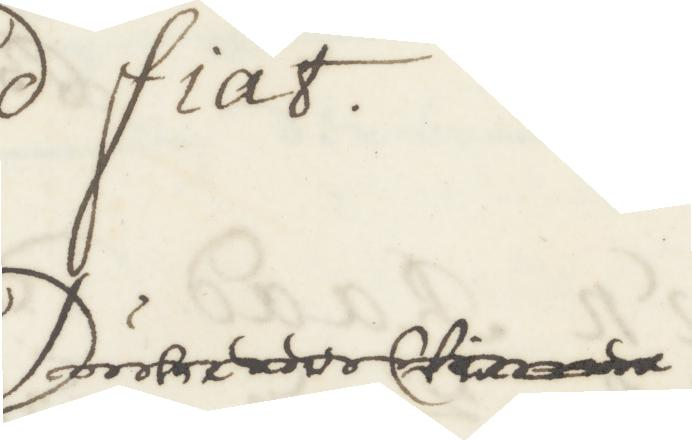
D'heer Vincen
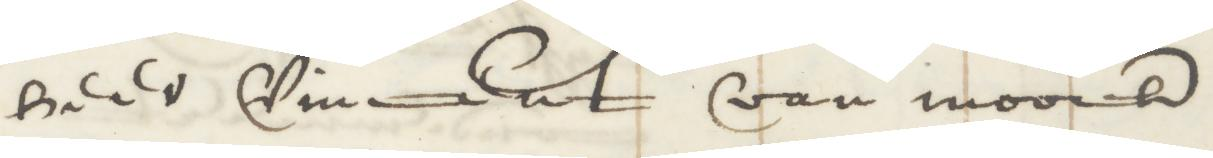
heer Vincent van moock
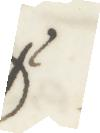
D'
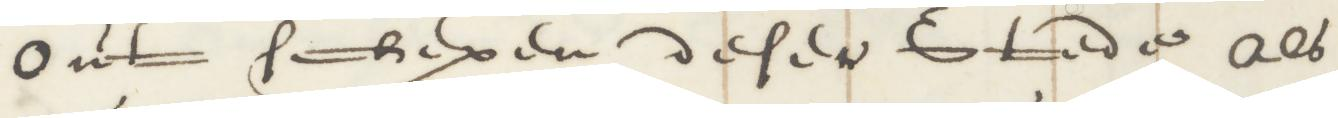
out schepen deser stede als
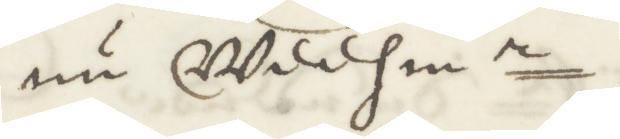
nu Weesm=r
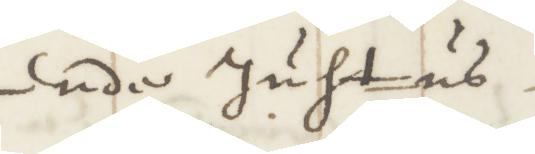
ende Justus
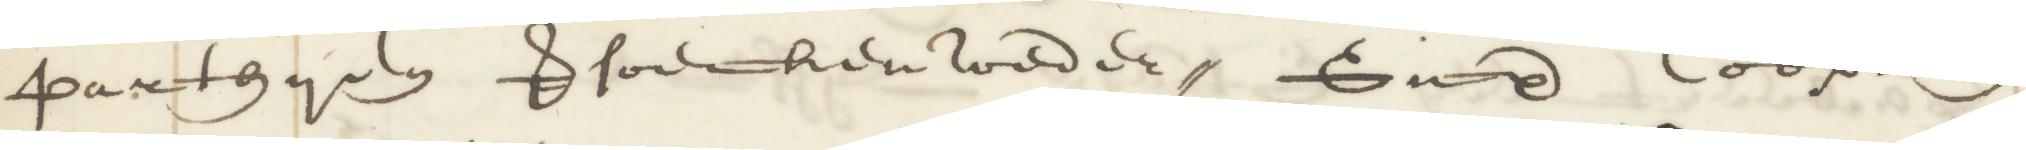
parthijen versoecken weder„ Sicx Coopman
